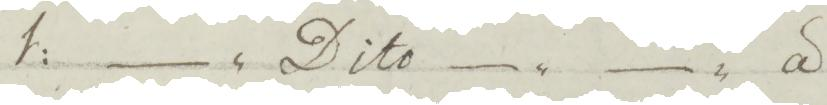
1: —„ Dito —„ —„ a
